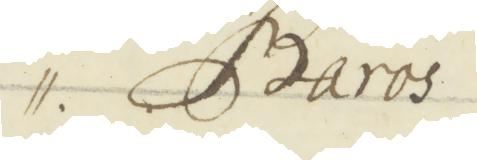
„ Baros
